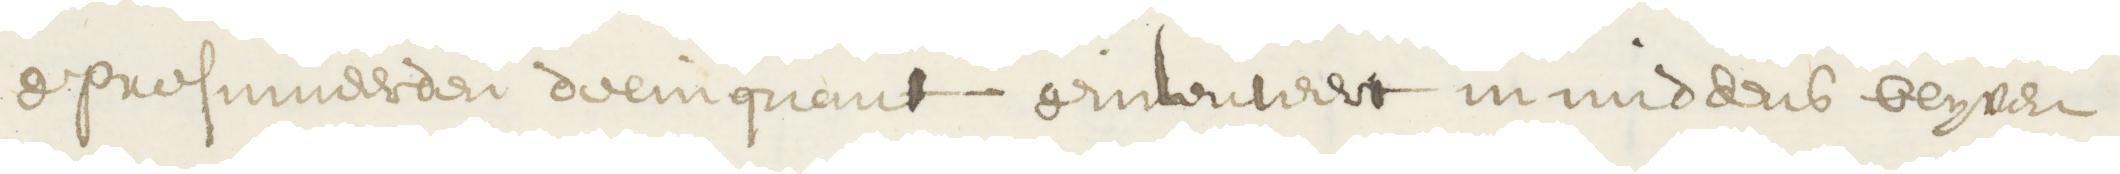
gepresumeerden delinquant geintenteert in middens blijven
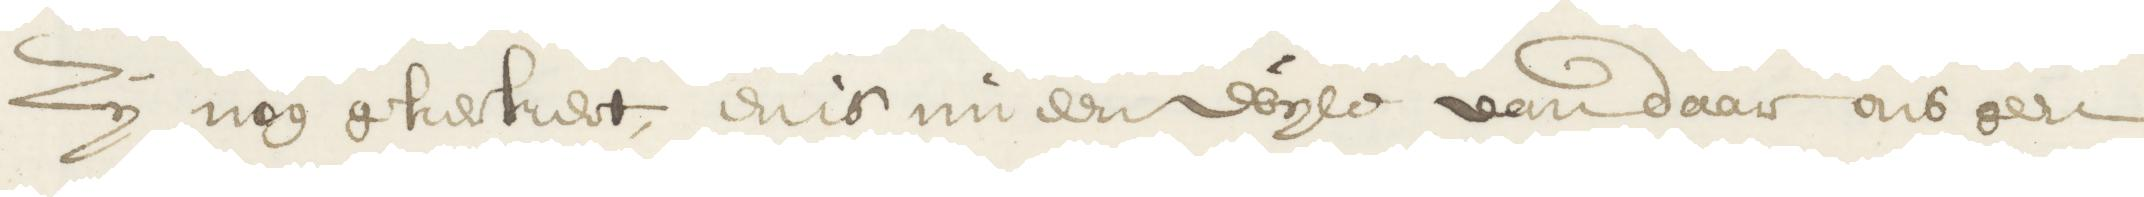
zij nog gekerkert, en is nu een wijle van daar ons geen
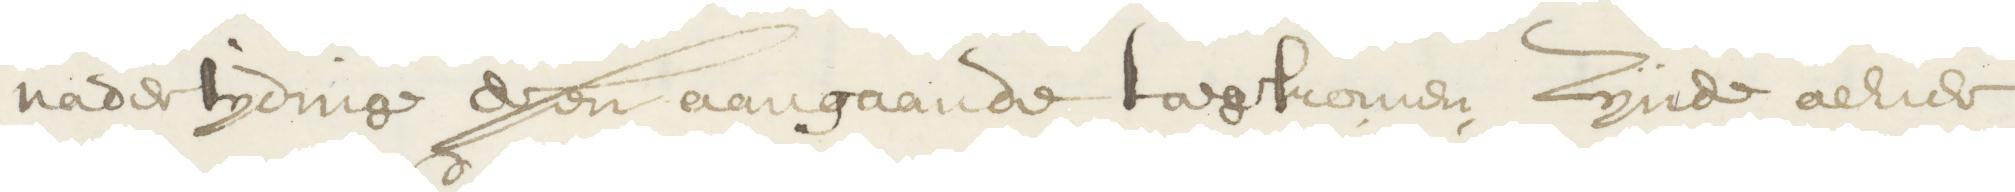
nader tijdinge desen aangaande toegekomen, zijnde alhier
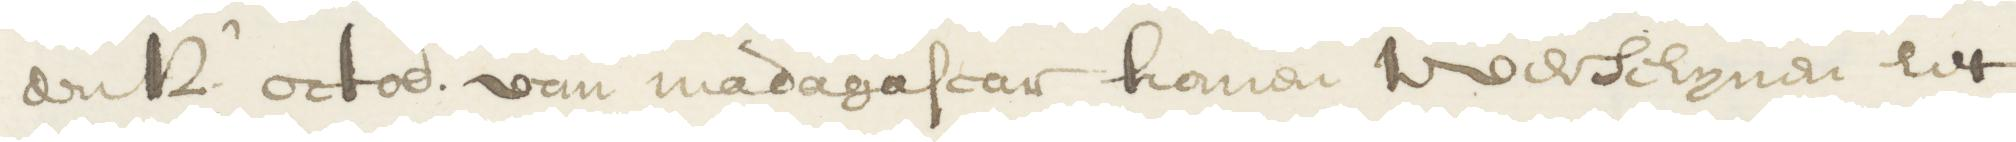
den 12.' octob. van madagascar komen teverschijnen het
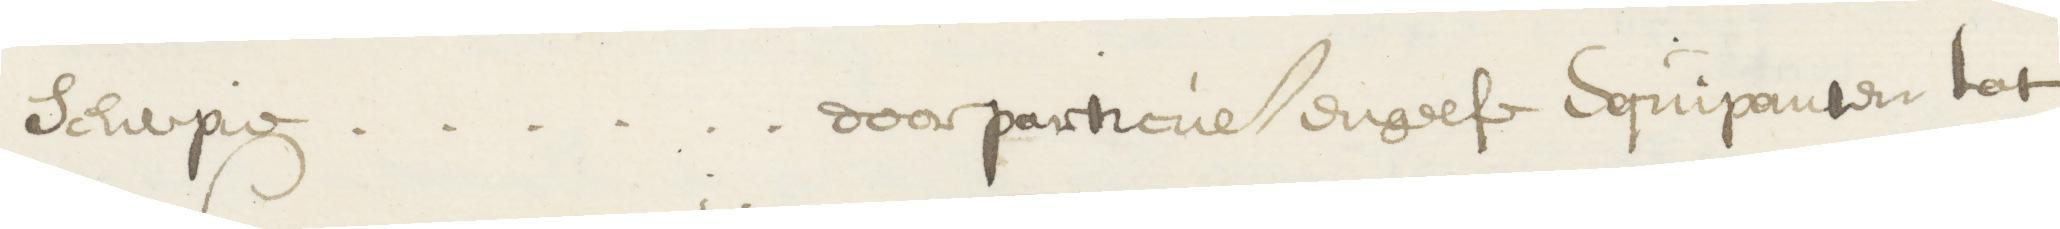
scheepie - - - - - - - door particulijk engelse Equipanten tot
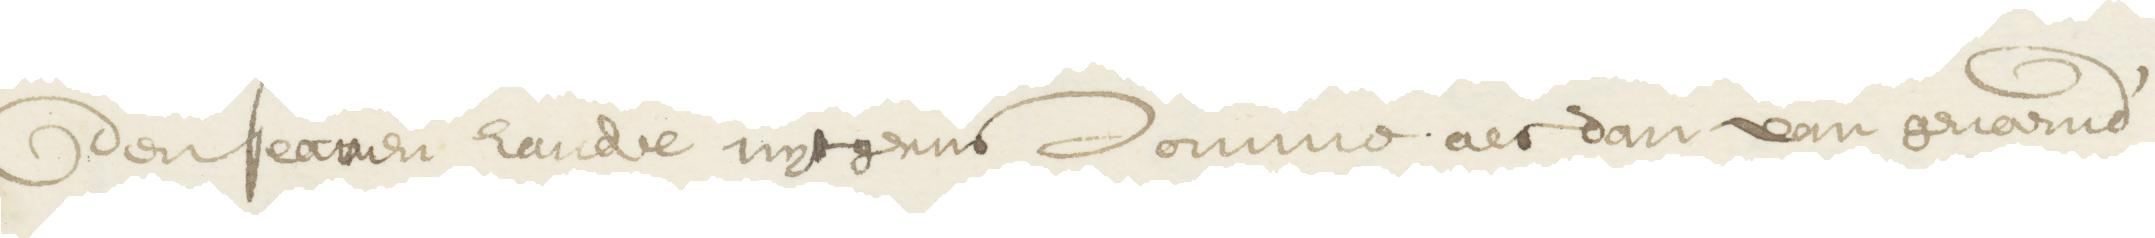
den slaven handel uijtgerust omme als dan van genoemd'
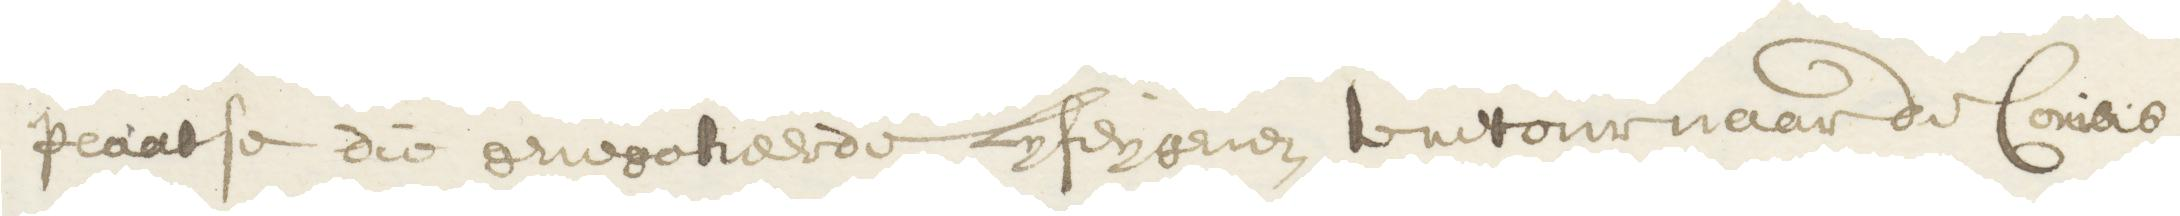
plaatse die genegotieerde lijfeijgenen teretour naar de Coribis
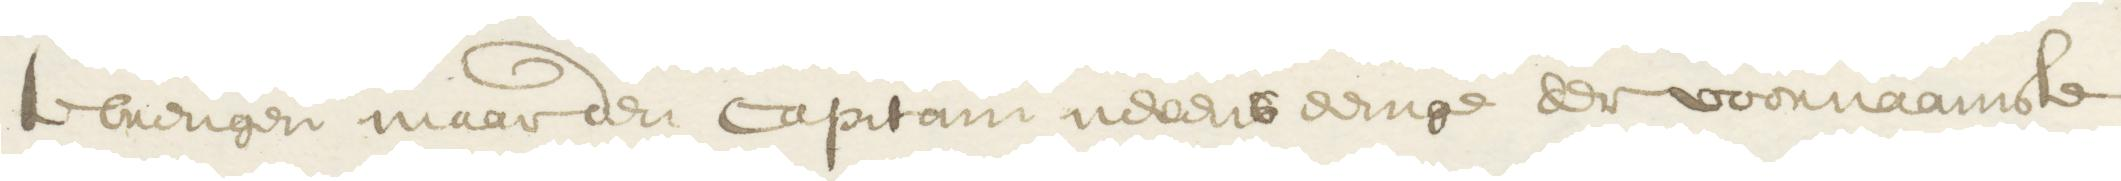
te brengen maar den capitain nevens eenige der voornaamste
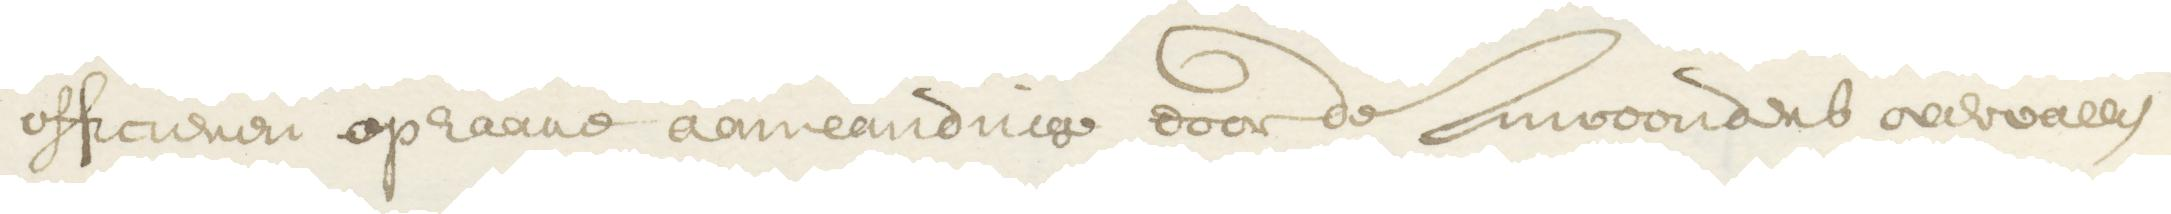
officieren op haare aanlandinge door de Inwoonders overvallen
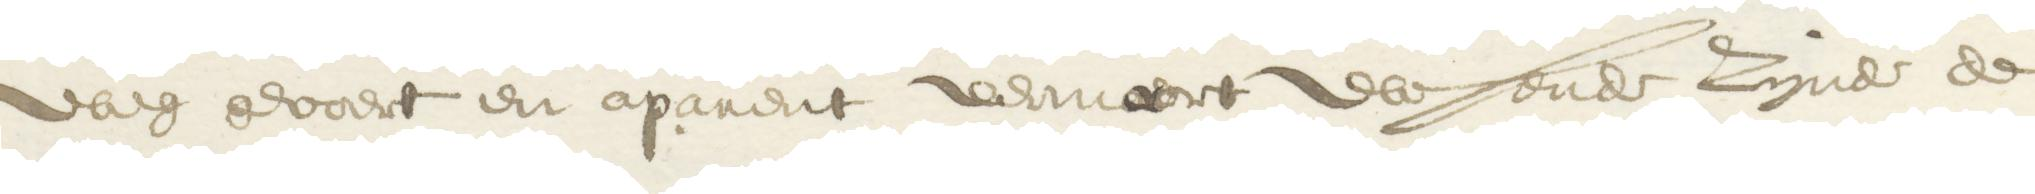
weg gevoert en aparent vermoort wesende zijnde de
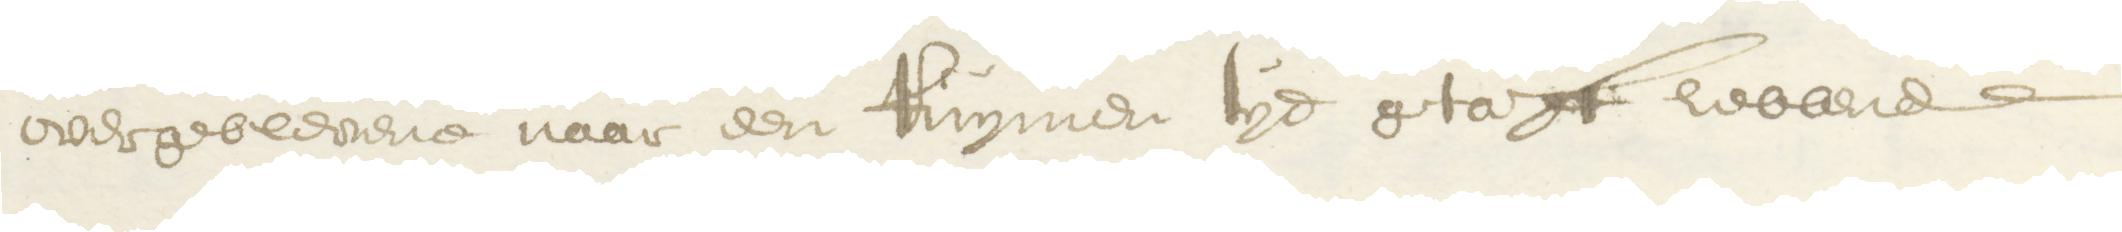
overgeblevene naar een Ruijmen tijd getoeft hebbende
